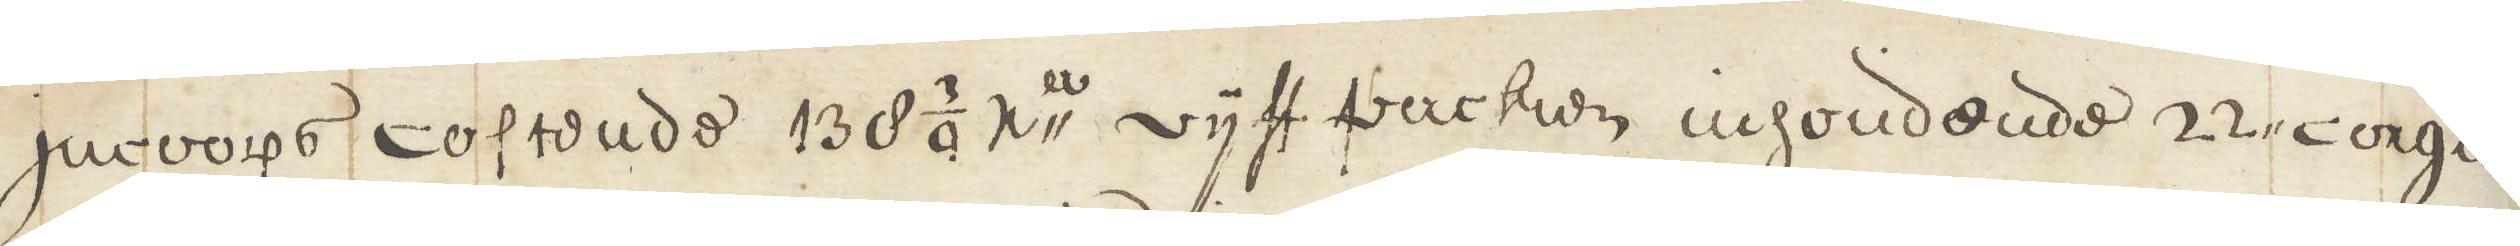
jncoops costende 138¾ r„a vijff packen inhoudende 22„ corgie
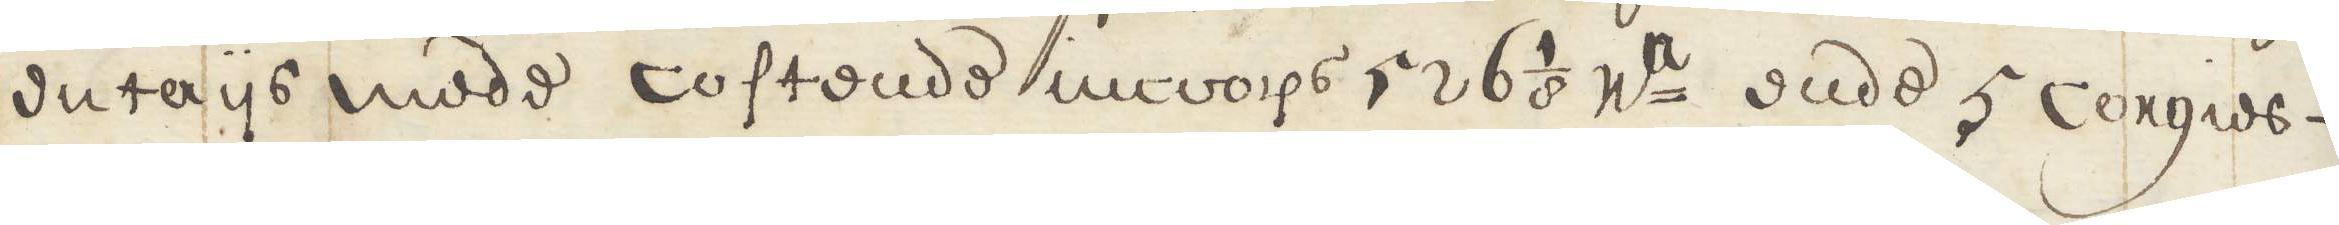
attentaijs mede costende incoops 526 1/8 r=a ende 5 corgies-
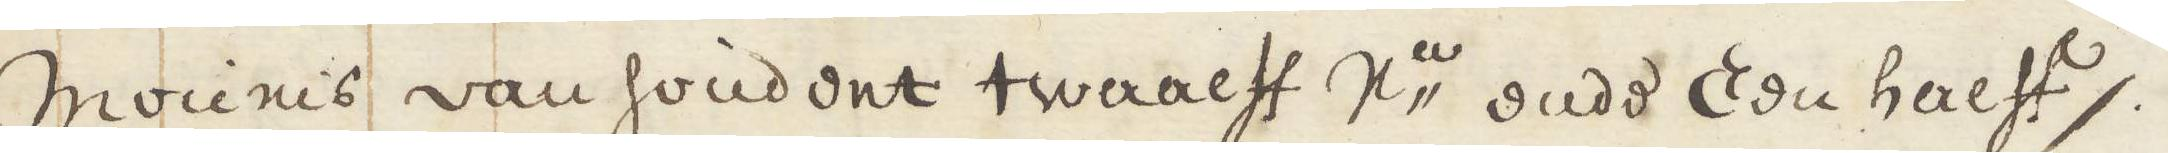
Mouris van hondert twaalff r=a ende Een halff/.
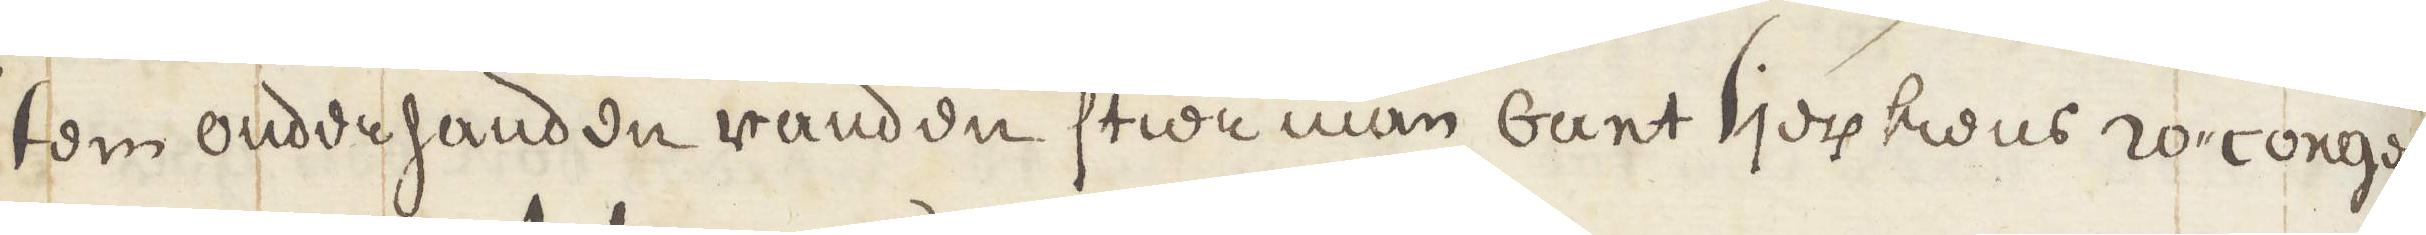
tem onderhanden vanden stier man bart tjepkens 20„ corge
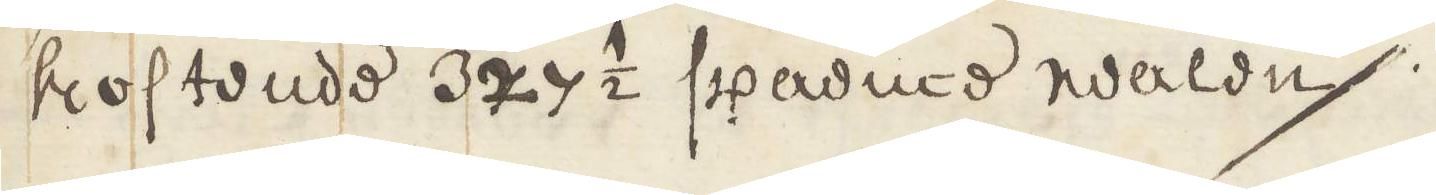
kostende 327½ spaence realen/.
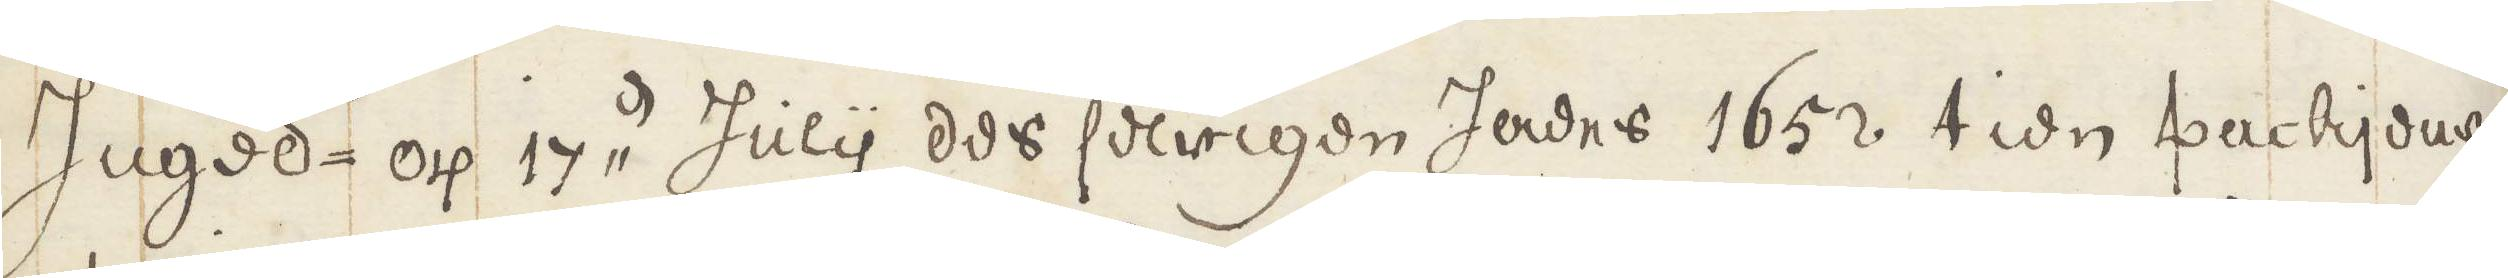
Jngel=r op 17„e Julij des selvigen Jaers 1652 tien packjens
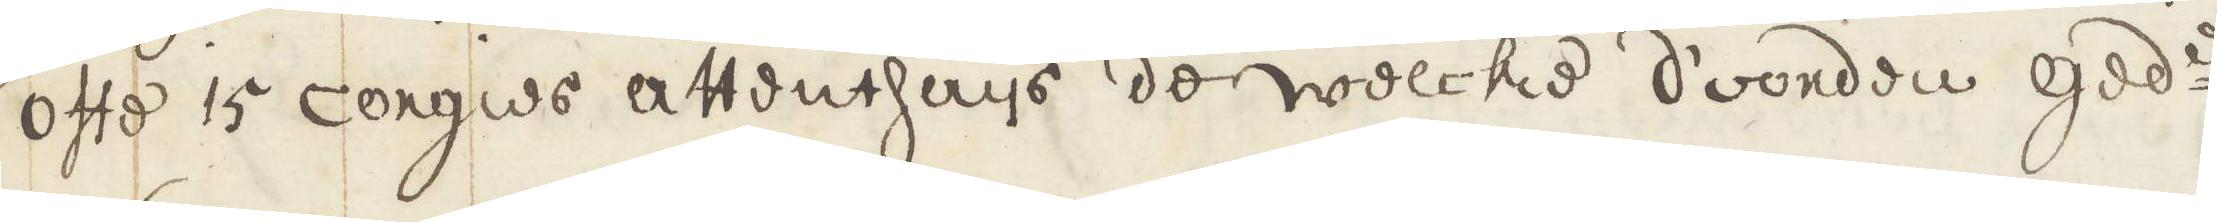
ofte 15 corgies attenthaijs de welcke d’oorden ged=e
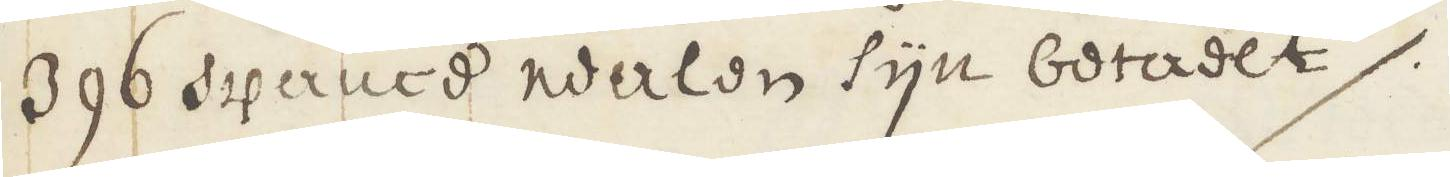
396 spaence realen sijn betaelt/.
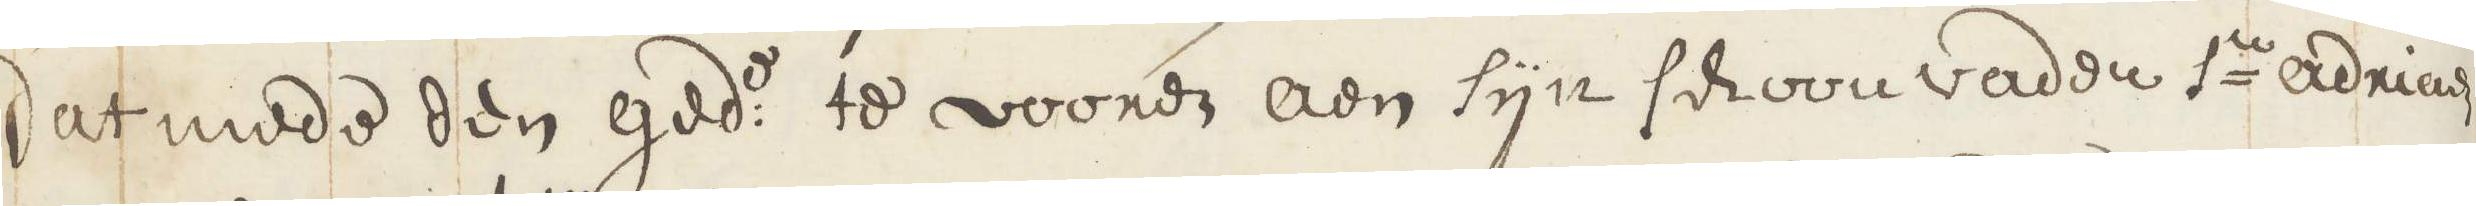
dat mede den ged:e te vooren aen sijn schoonvader h=r adriaen
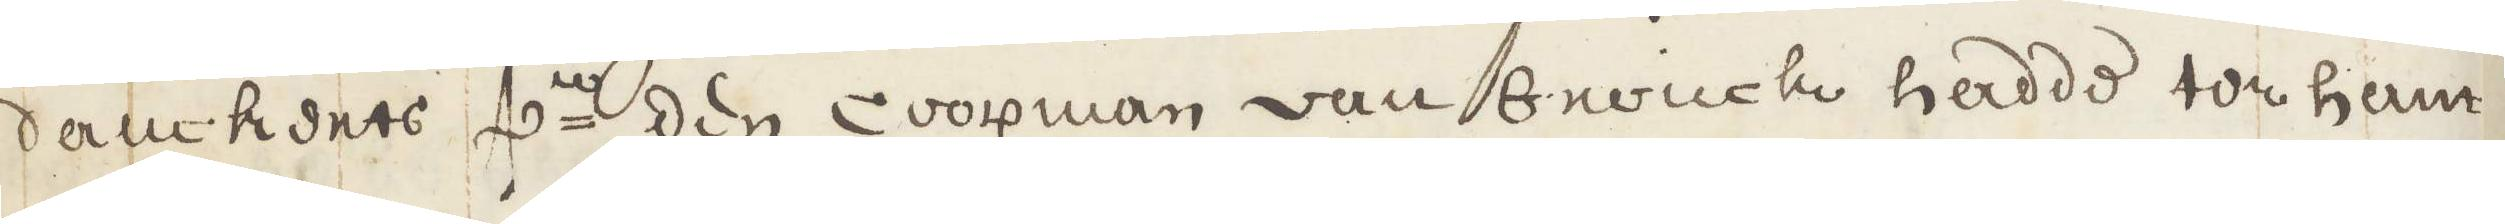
danckerts p=r den coopman van brouck hadde ter hant
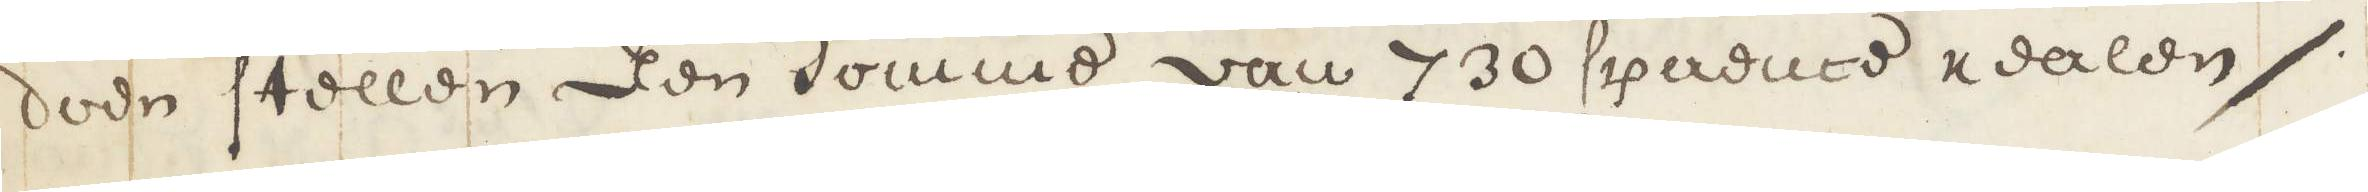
doen stellen Een somme van 730 spaence realen/.
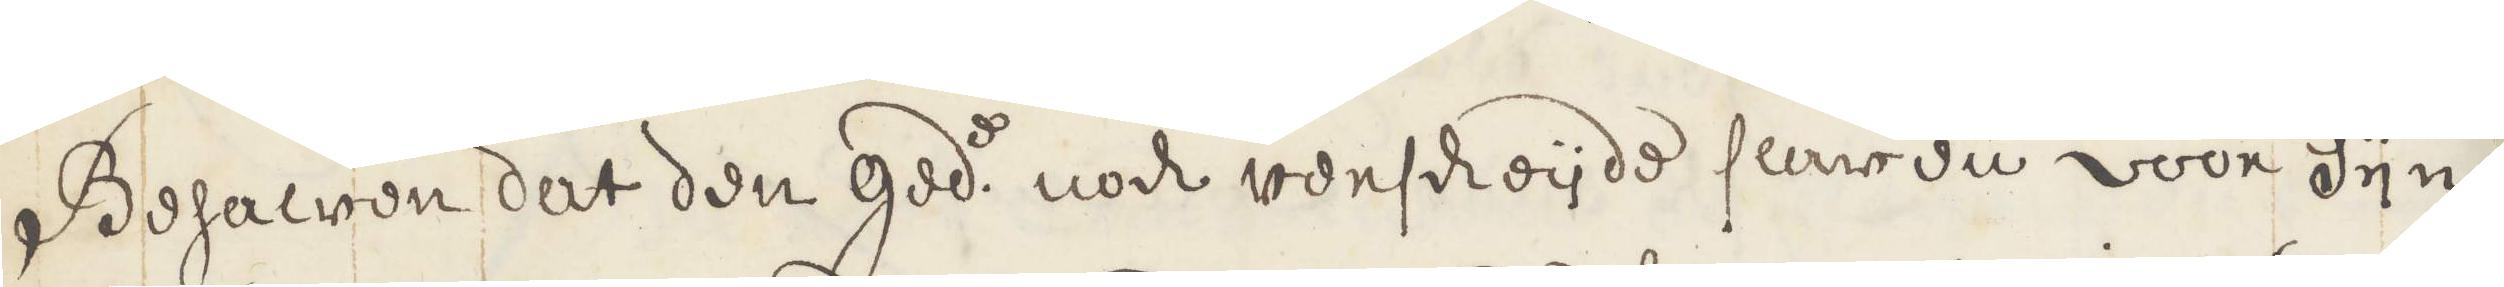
Behalven dat den ged. noch verscheijde slaven voor sijn
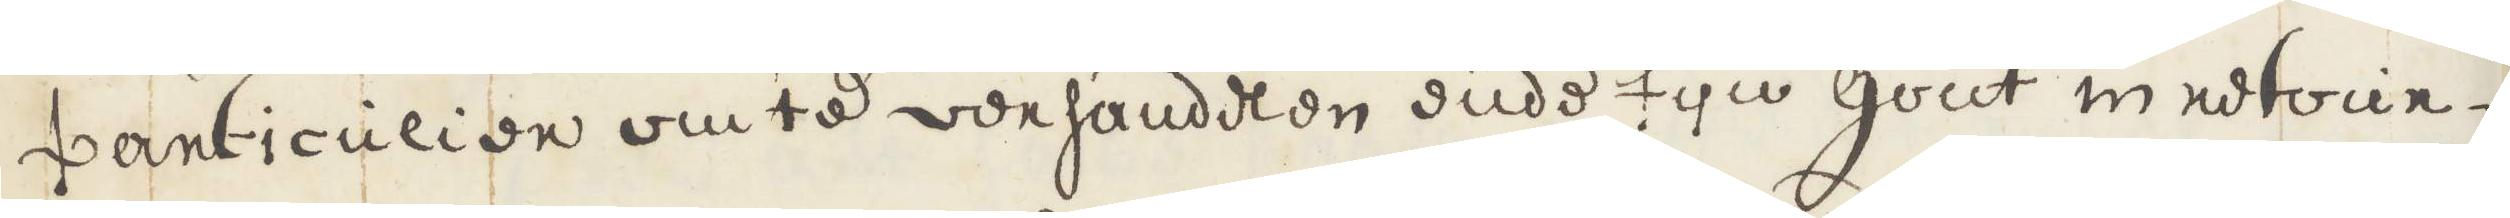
particulier om te verhandelen ende sijn gout in retour-
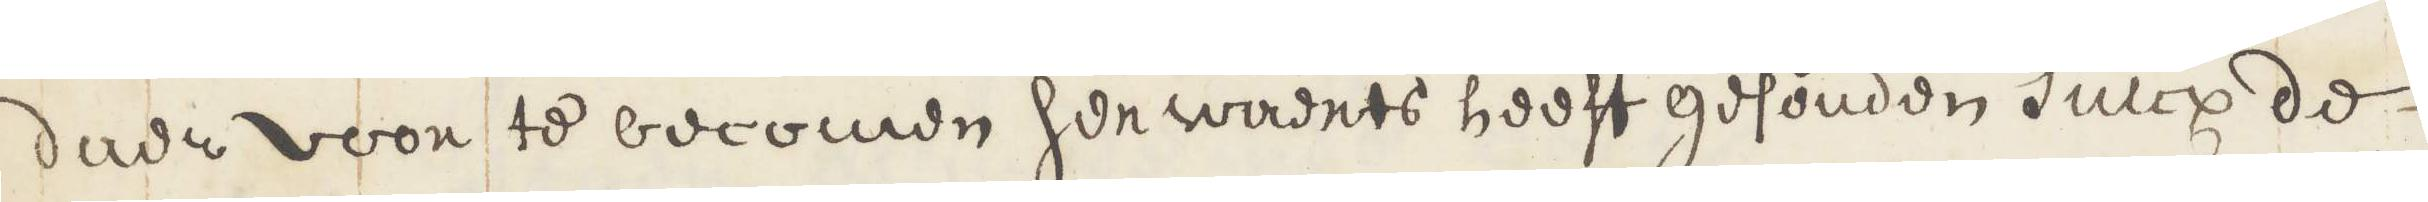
daer voor te becomen herwaerts heeft gesonden sulcx de
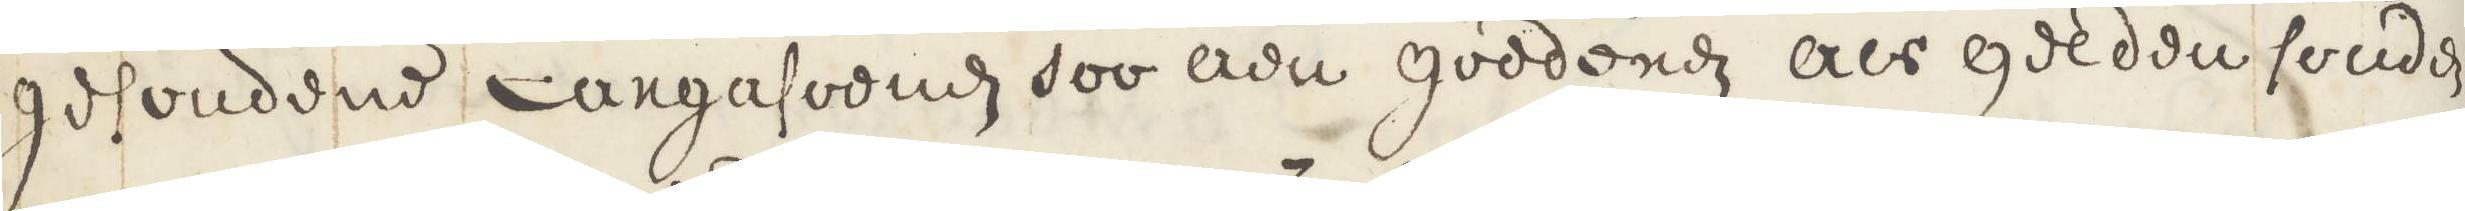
gesondene cargasoenen soo aen goederen als gelden souden
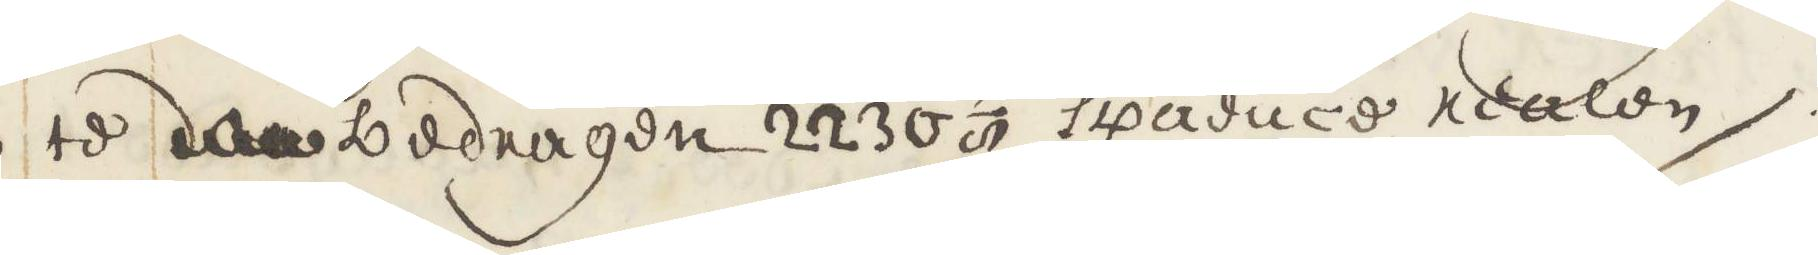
te dar bedragen 2230 7/8 spaence realen/.
